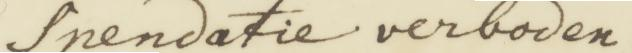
spendatie verboden
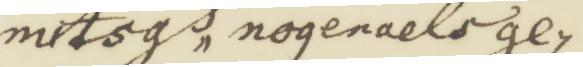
mitsg„s nogenaels ge
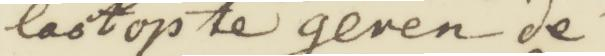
last op te geven de
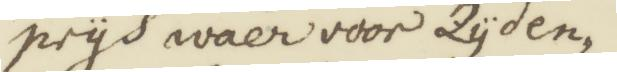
prijs waer voor zij den„
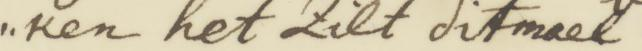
„ken het zilt ditmael
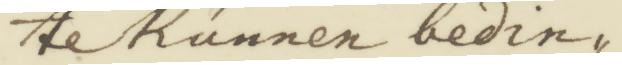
te kunnen bedin„
